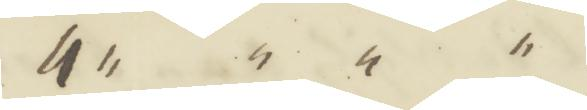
4 „ „ „ „
